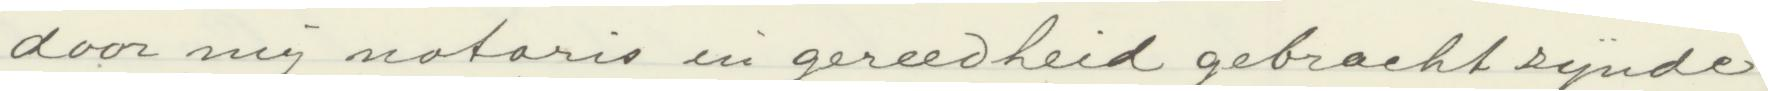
door mij notaris in gereedheid gebracht zijnde
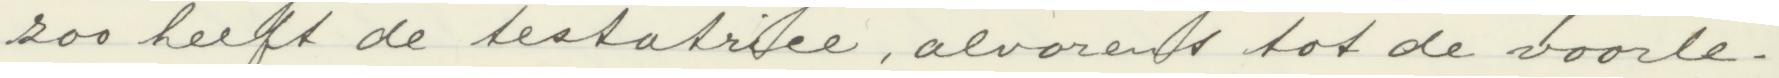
zoo heeft de testatrice, alvorens tot de voorle-
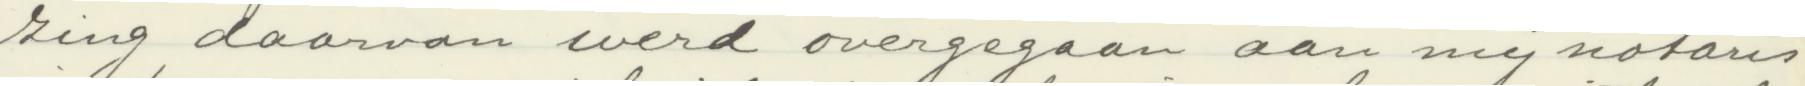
zing daarvan werd overgegaan aan mij notaris
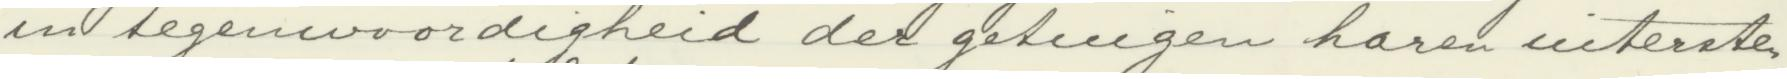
in tegenwoordigheid der getuigen haren uitersten
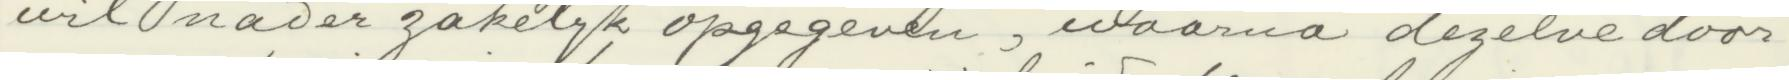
wil nader zakelyk opgegeven, waarna dezelve door
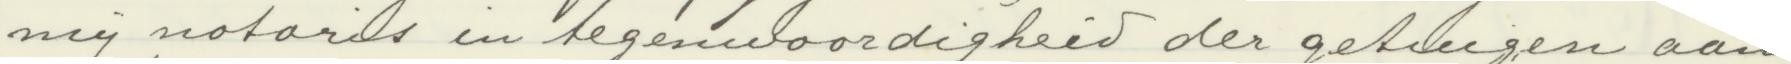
my notaris in tegenwoordigheid der getuigen aan
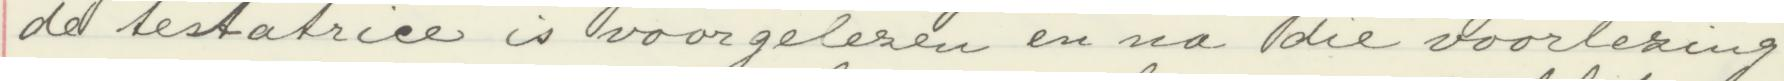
de testatrice is voorgelezen en na die voorlezing
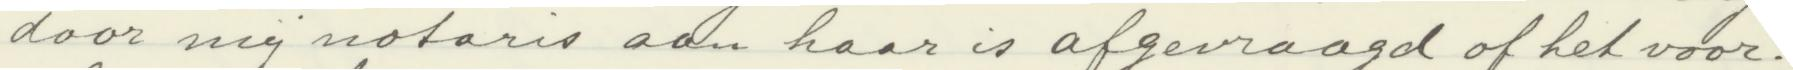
door mij notaris aan haar is afgevraagd of het voor-
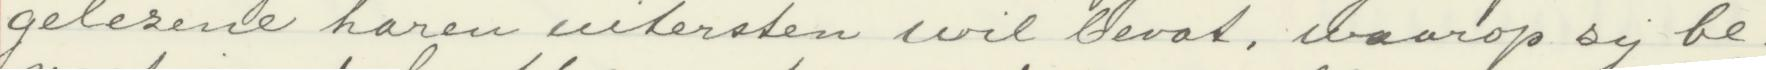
gelezene haren uitersten wil bevat, waarop zij be
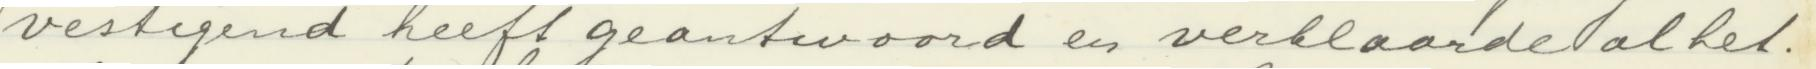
vestigend heeft geantwoord en verklaarde al het.
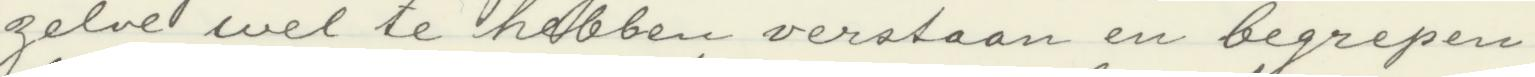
zelve wel te hebben verstaan en begrepen
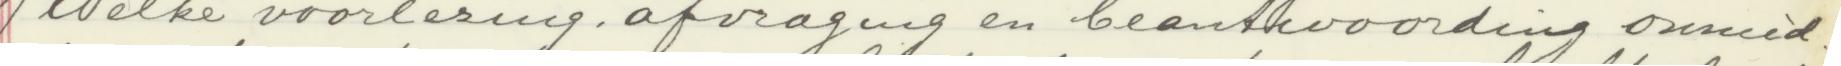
Welke voorlezing, afvraging en beantwoording onmid.
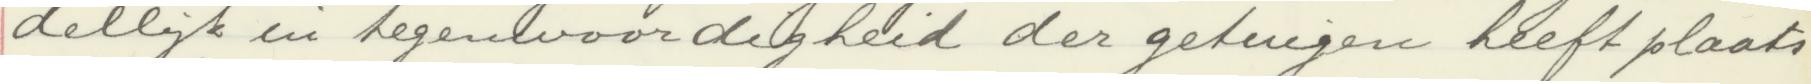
dellijk in tegenwoordigheid der getuigen heeft plaats
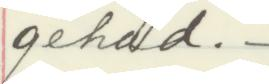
gehad.
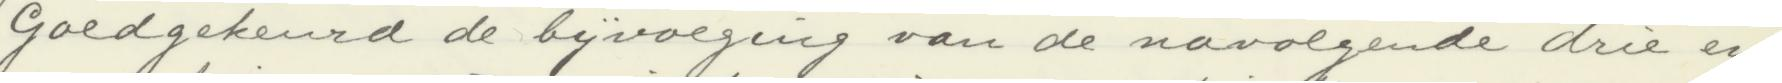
Goedgekeurd de bijvoeging van de navolgende drie en
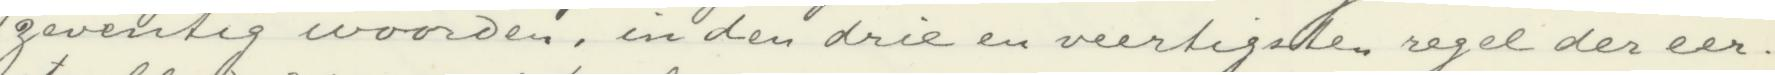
zeventig woorden, in den drie en veertigsten regel der eer
